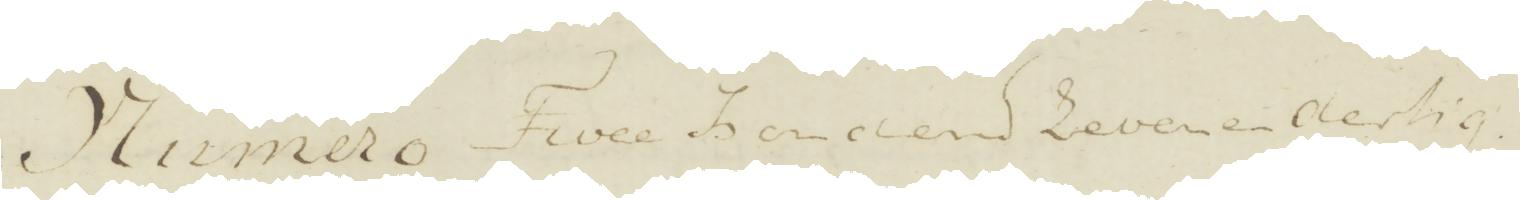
Numero Twee Honderd Zeven en dertig.
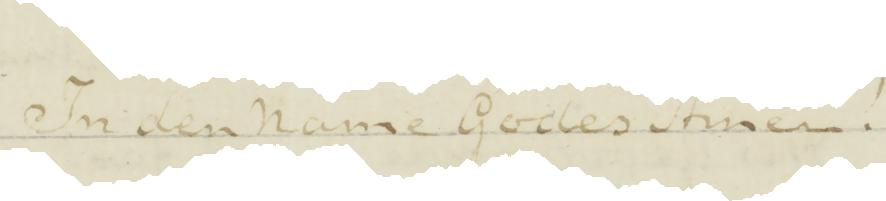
Jn den Name Godes Amen!
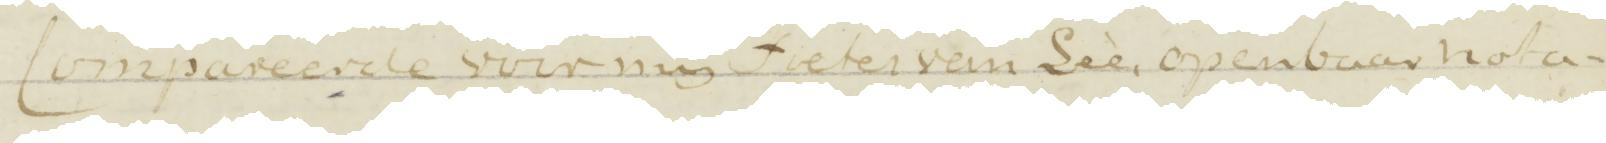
Compareerde voor mij Pieter van Leè, openbaar nota-
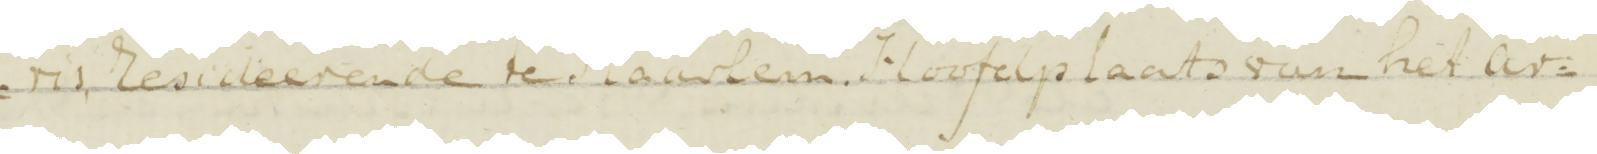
=ris resideerende te Haarlem. Hoofdplaats van het ar=
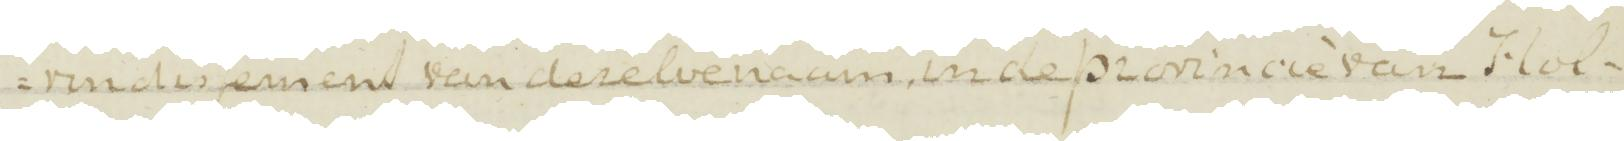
=rondissement van dezelve naam, in de provincie van Hol-
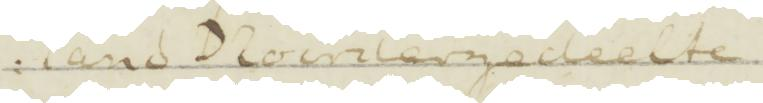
=land Noordergedeelte
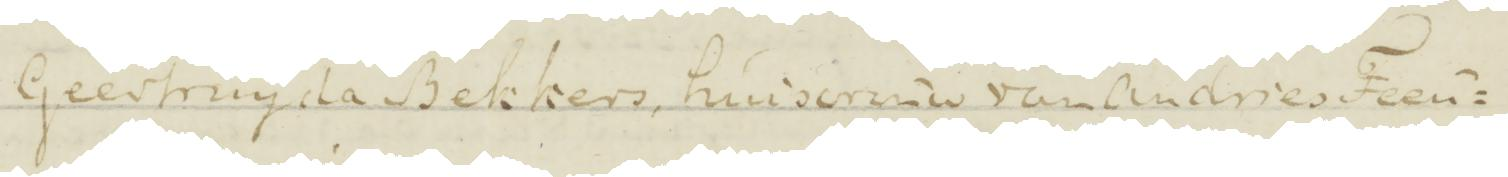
Geertruijda Bekkers, huisvrouw van andries Teeu=
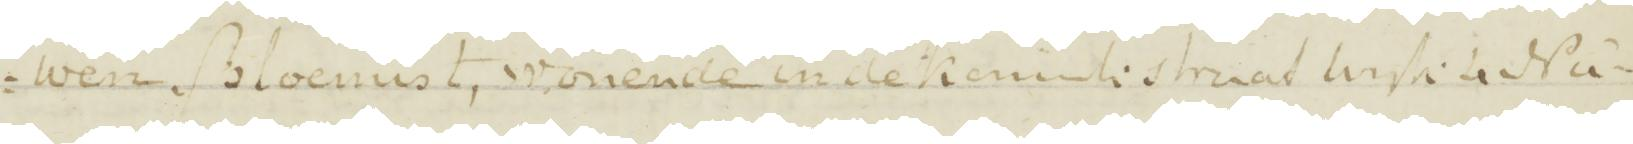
=wen Bloemist, wonende in de Koninkstraat wyk 4 Nu=
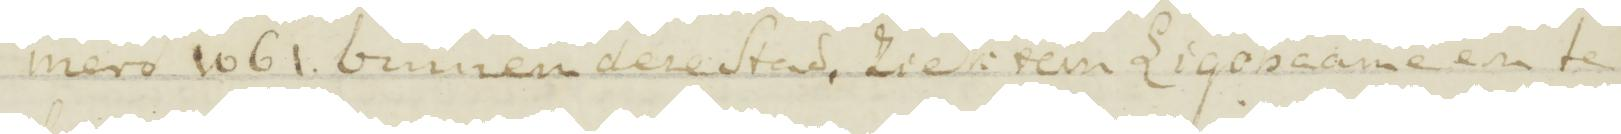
mero 1061. binnen deze stad, ziek van Ligchaame en te
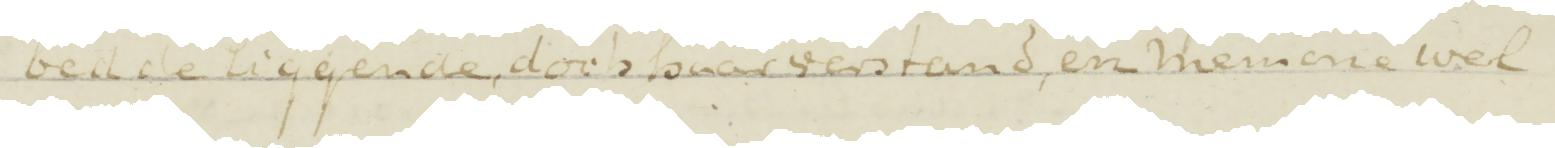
bedde liggende, doch haar verstand, en memorie wel
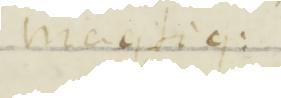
magtig:
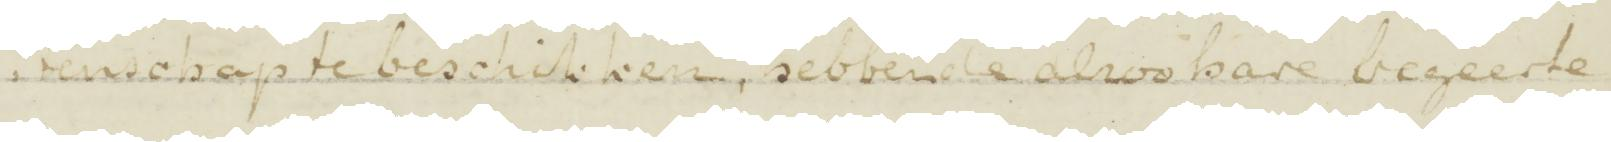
„tenschap te beschikken, hebbende alzoo hare begeerte
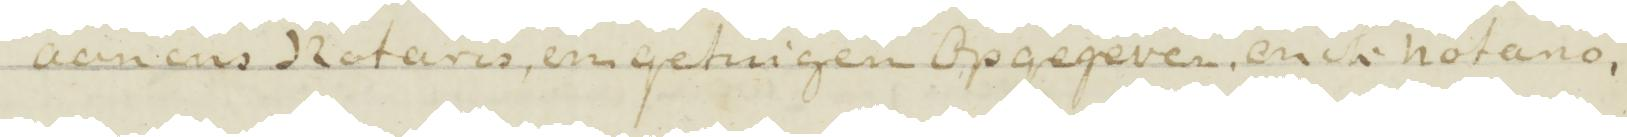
aan ons Notaris, en getuigen Opgegeven, en ik notaris,
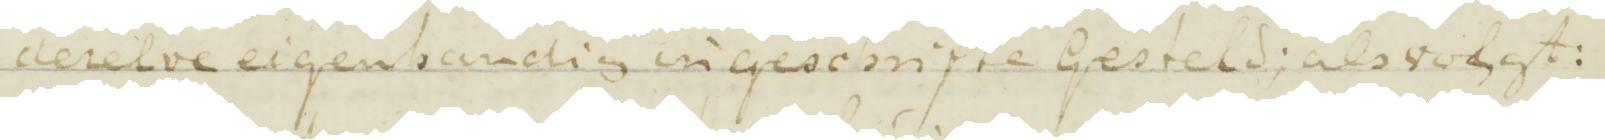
dezelve eigenhandig in geschrifte Gesteld; als volgt:
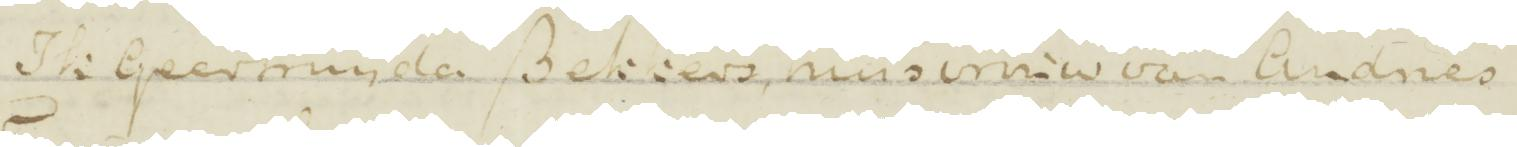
Jk Geertuijda Bekkers, huisvrouw van Andries
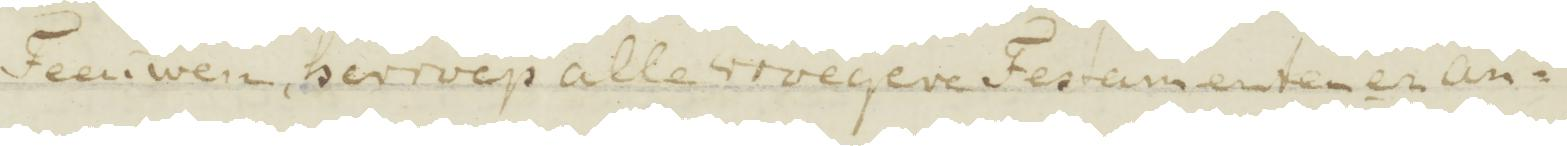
Teeuwen, herroep alle vroegere Testamenten en an=
